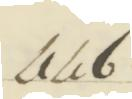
446
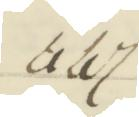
447
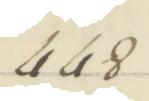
448
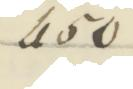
450
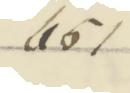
451
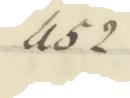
452
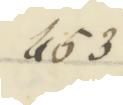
453
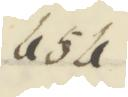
454
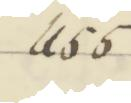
455
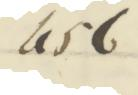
456
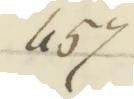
457
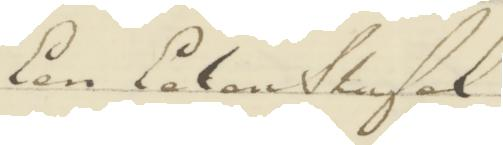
Een Eetenstafel
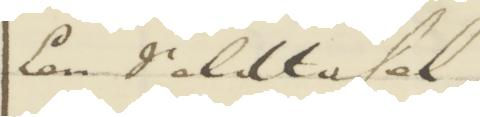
Een Veldtafel
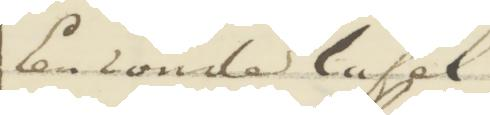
Een ronde tafel
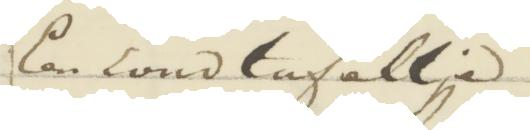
Een rond tafeltje
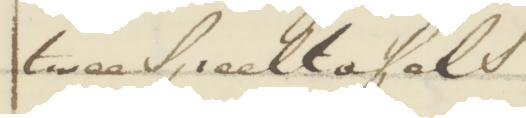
twee speeltafels
